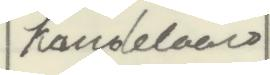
kandelaars
